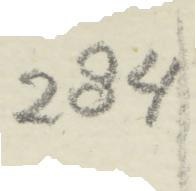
284
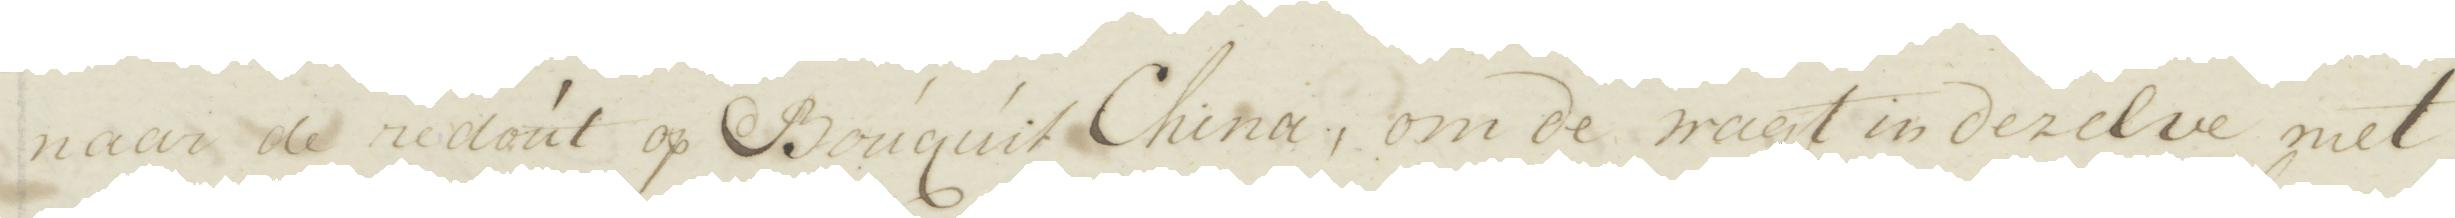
naar de redout op Bouquit China, om de wagt in dezelve met
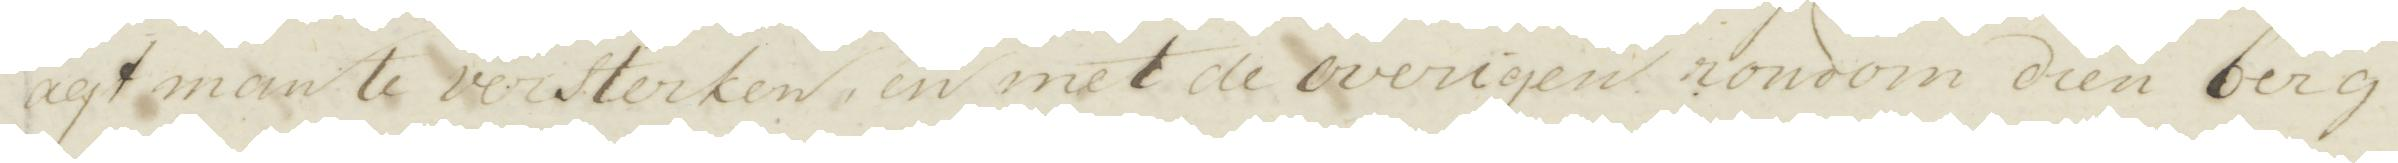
agt man te versterken, en met de overigen rondom dien berg
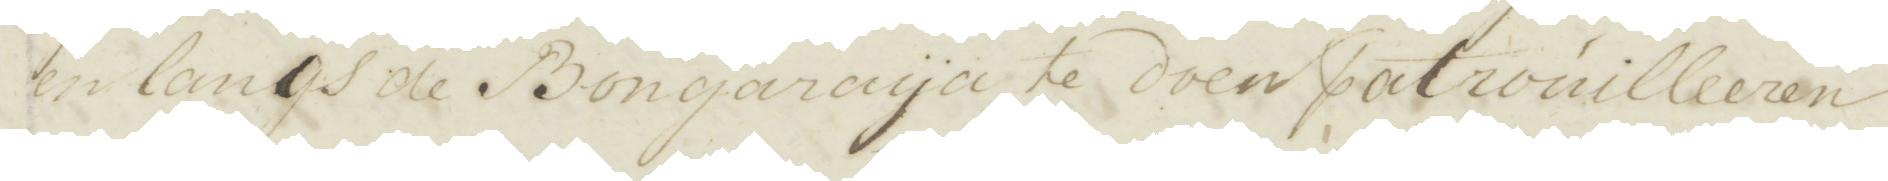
en langs de Bongaraija te doen patrouilleeren
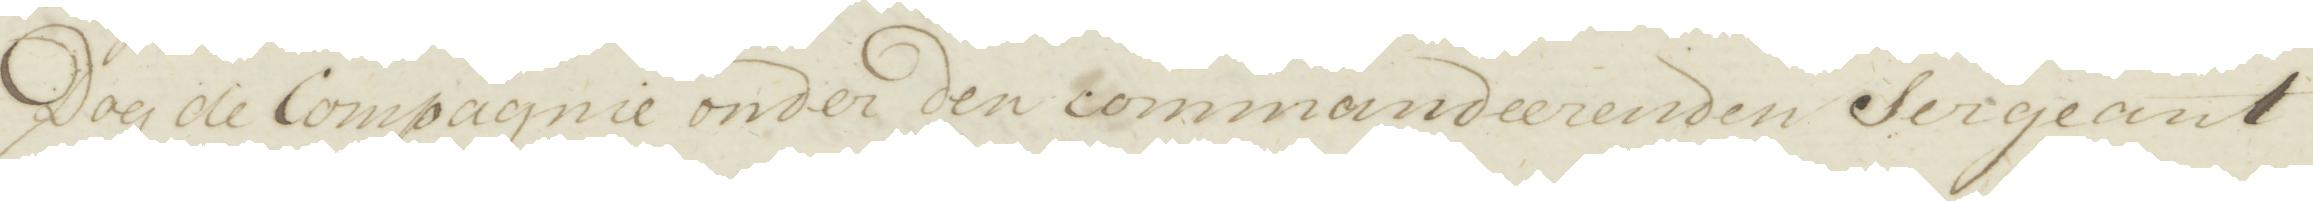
Dog de Compagnie onder den commandeerenden Sergeant
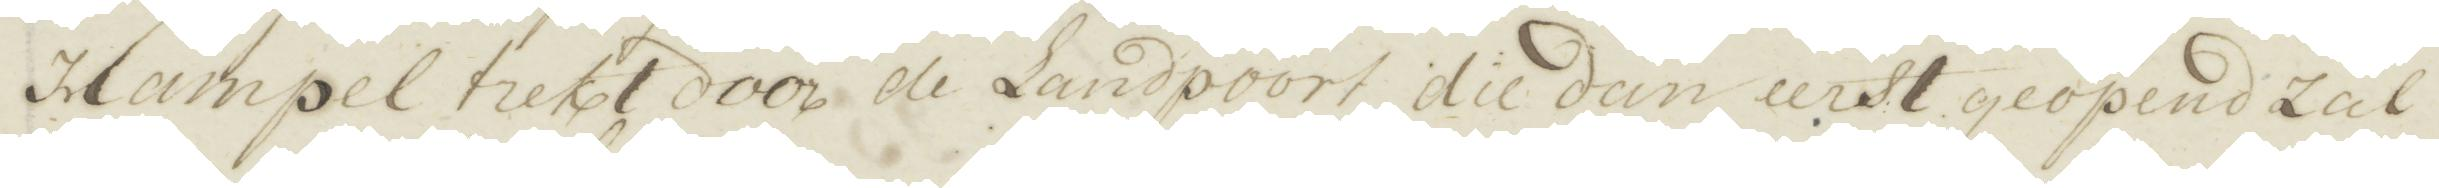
Hampel trekt door de Landpoort die dan eerst geopend zal
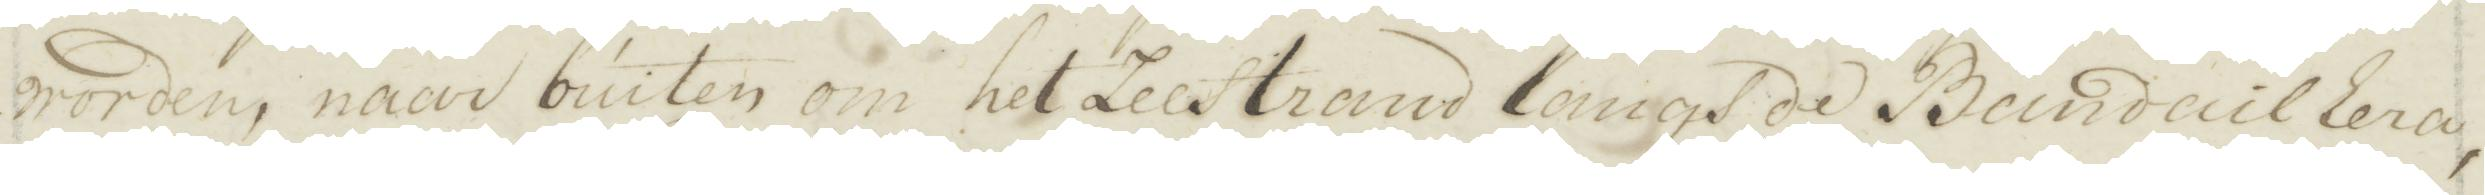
worden, naar buiten om het Zeestrand langs de Bandail hera,
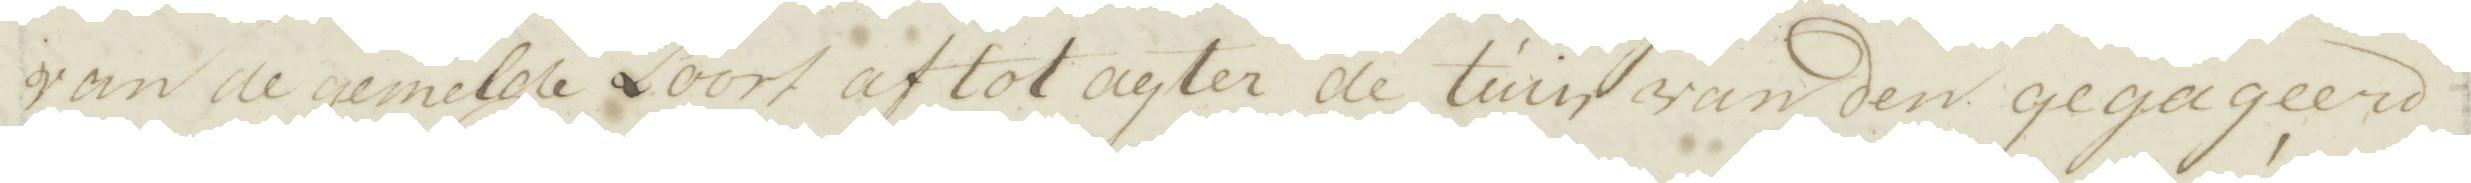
van de gemelde Poort af tot agter de tuin van den gegageerd
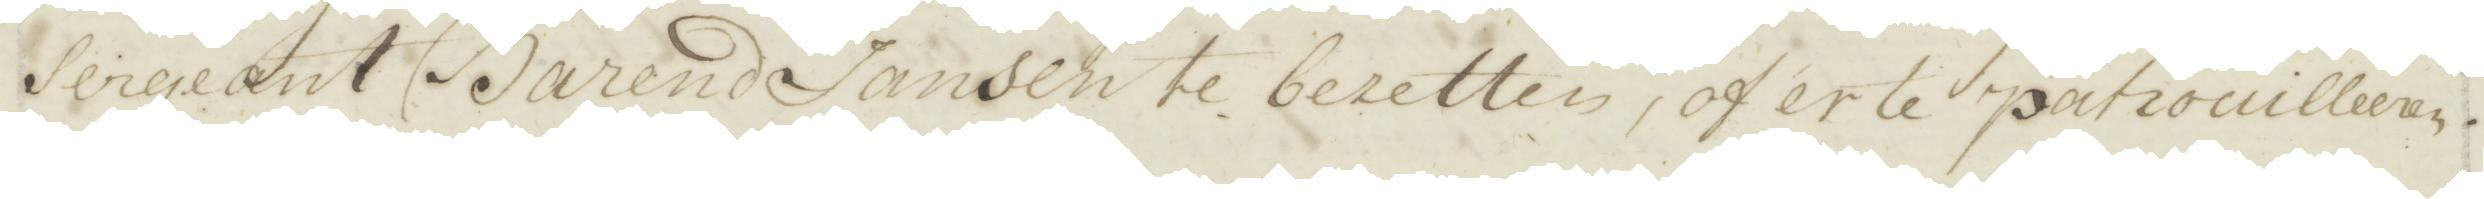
sergeant Barend Jansen te bezetten, of er te patrouilleeren.
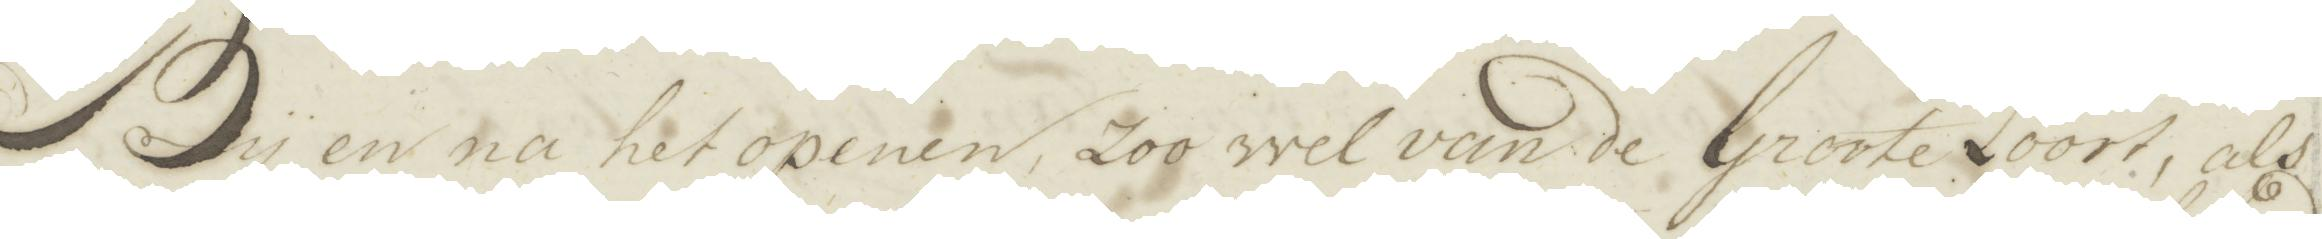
Bij en na het openen, Zoo wel van de Groote Poort, als
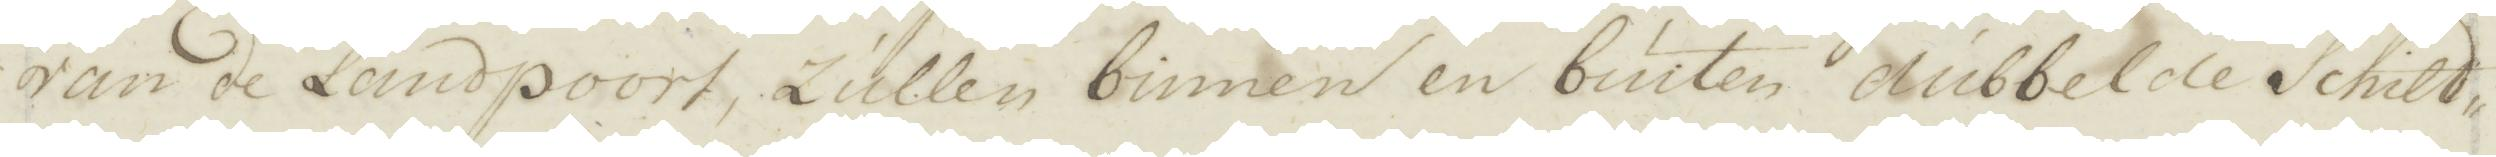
van de Landpoort, zullen binnen en buiten dubbel de Schild„
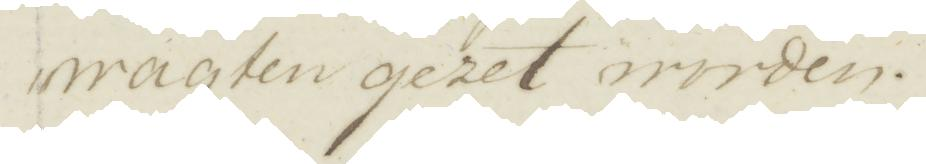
wagten gezet worden.
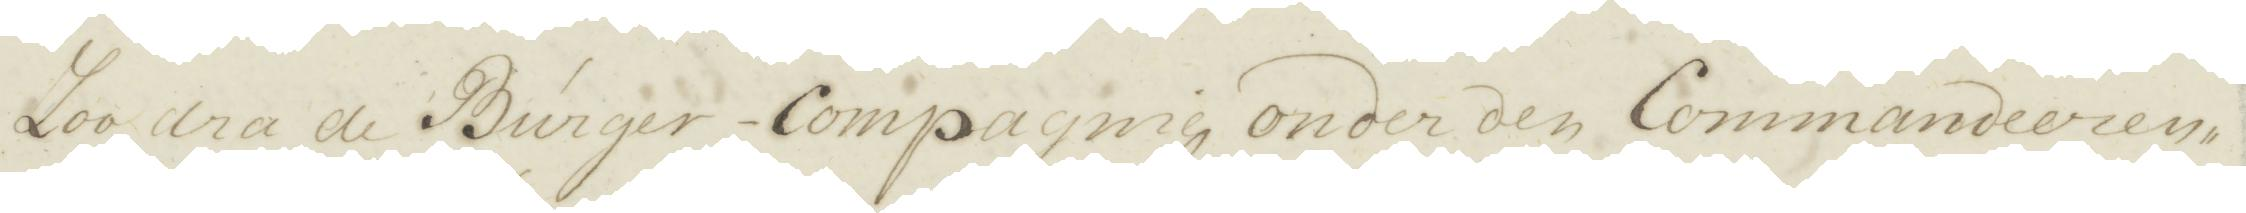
Zoo dra de Burger-Compagnie onder den Commandeeren„
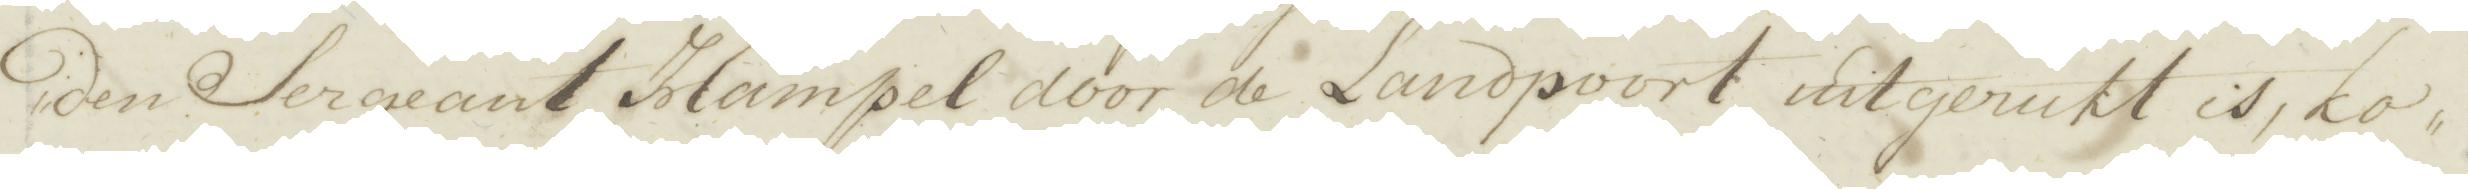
den Sergeant Hampel door de Landpoort uitgerukt is, ko„
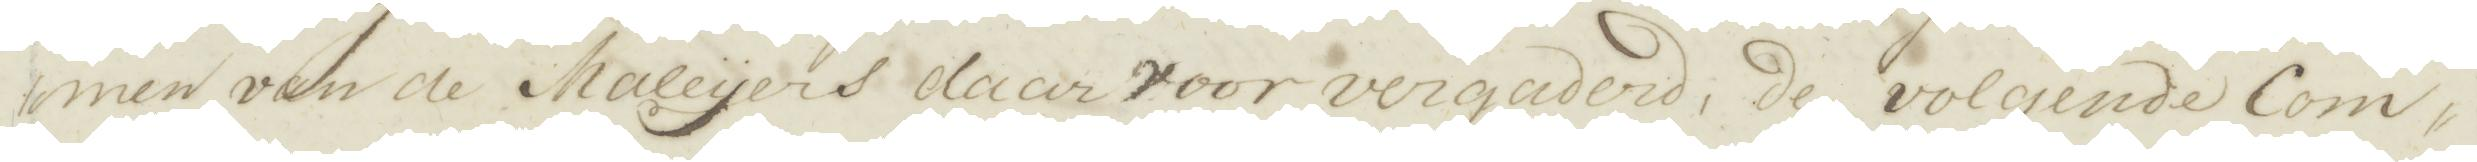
„men van de Maleijers daar voor vergaderd, de volgende Com„
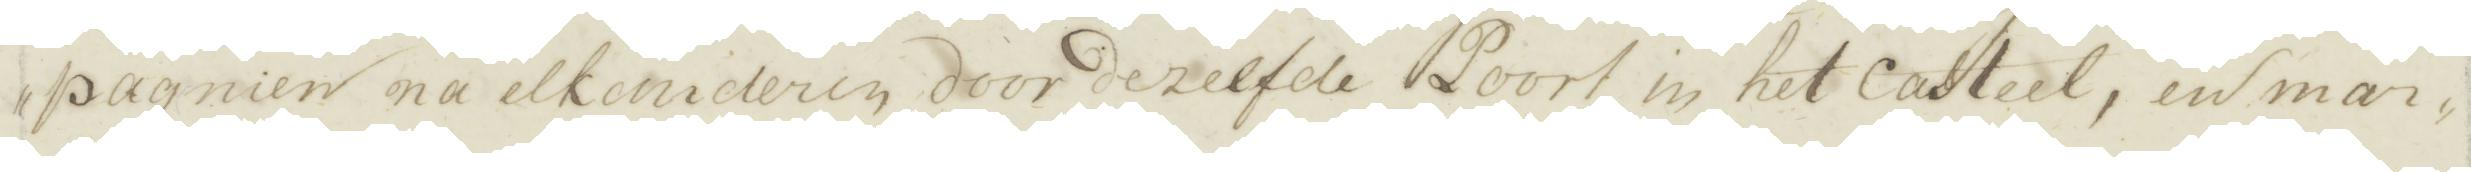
„pagnien na elkanderen door dezelfde Poort in het Casteel, en mar„
